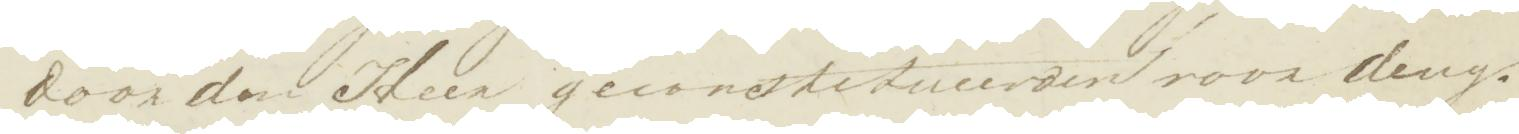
door den Heer geconstitueerden voor deug„
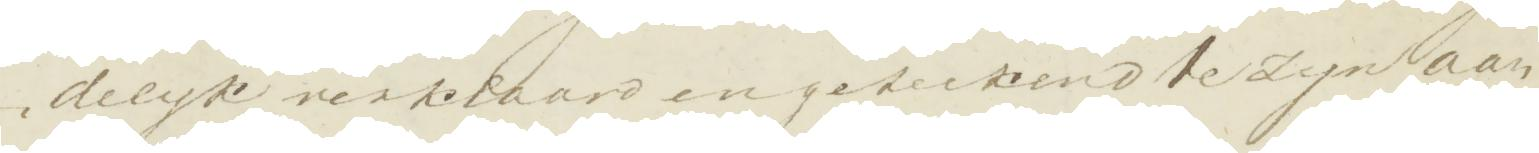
,delyk verklaard en geteekend te zyn aan
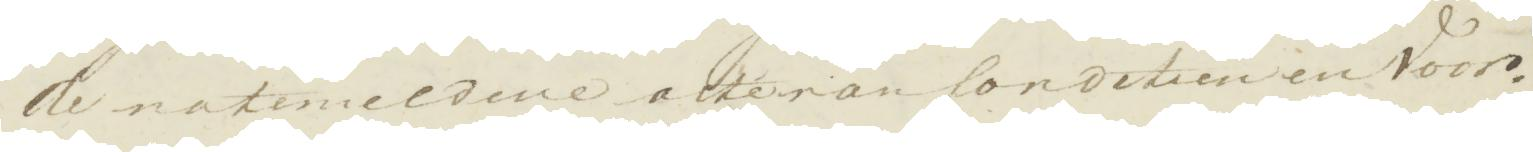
de natemeldene acte van Conditien en Voor-
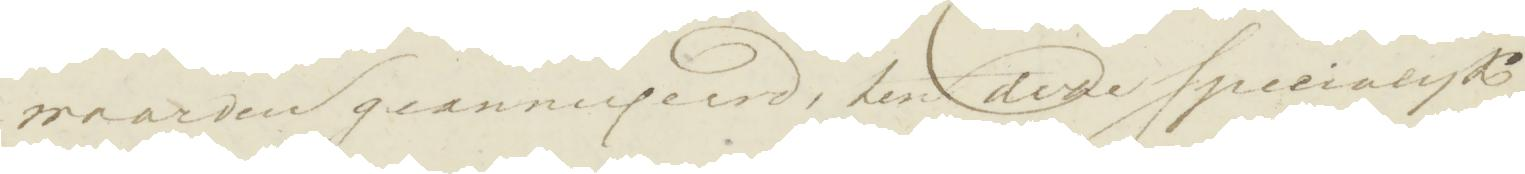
=waarden geanneexeerd, ten deze specialyk
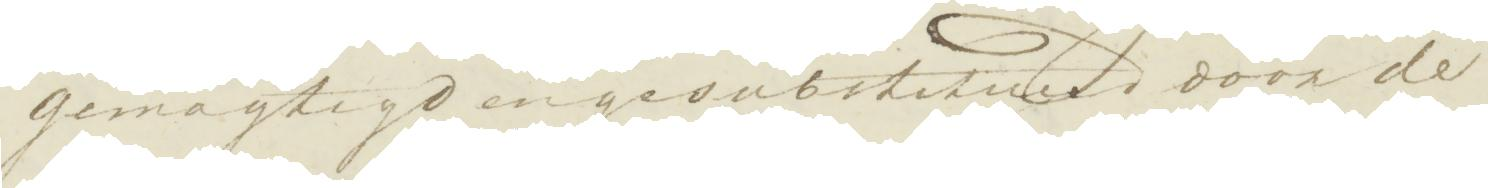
gemagtigd en gesubstitueerd door de
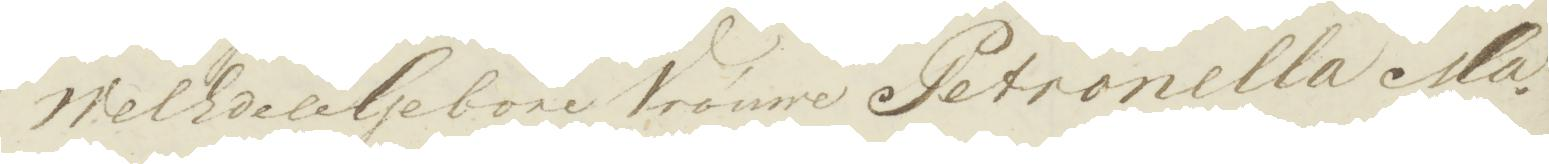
Wel Edele Gebore Vrouwe Petronella Ma,
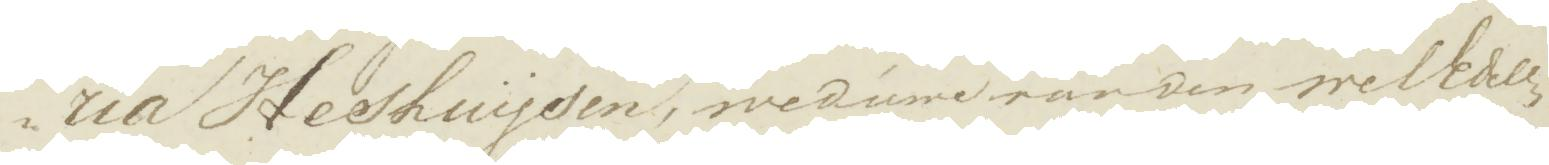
=ria Heshuijsen, weduwe van den welEdelen
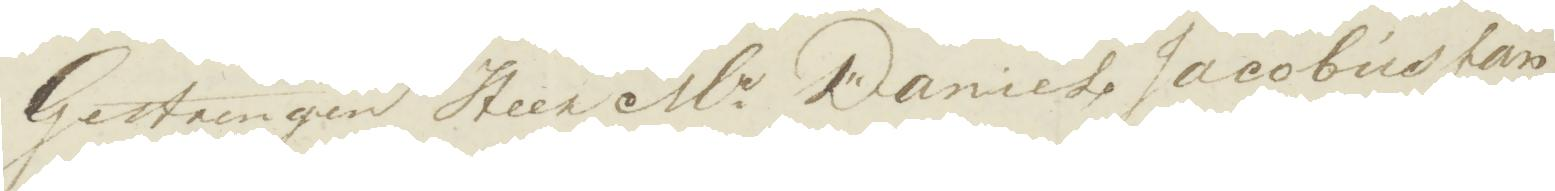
Gestrengen Heer M=r Daniel Jacobus Can
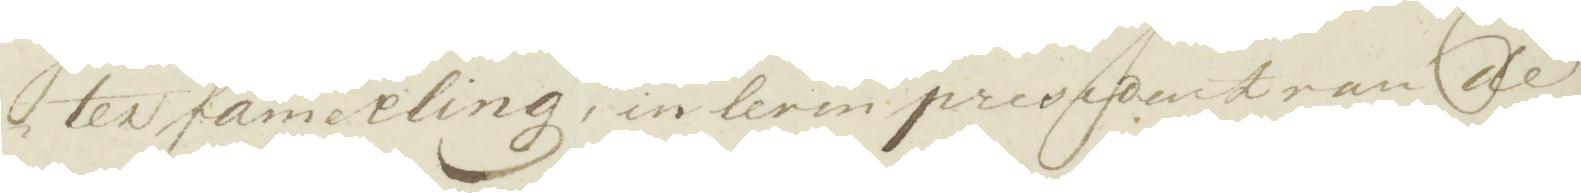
„ter Camerling, in leven president van de
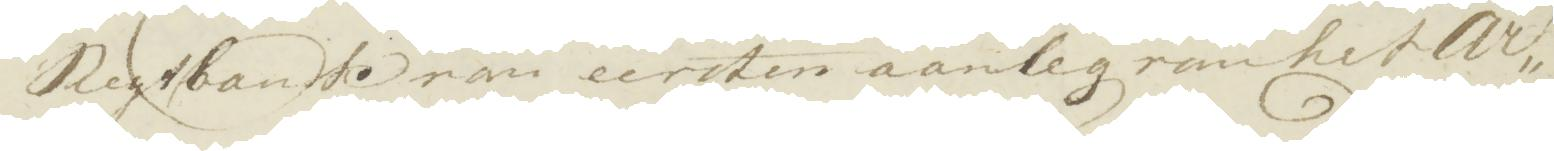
Regtbank van eersten aanleg van het Ar„
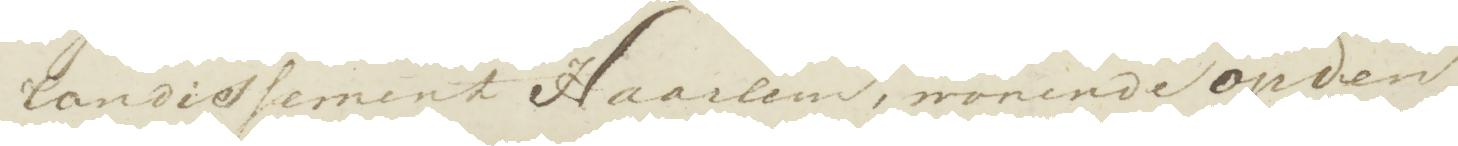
=rondissement Haarlem, wonende op den
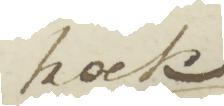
hoek
